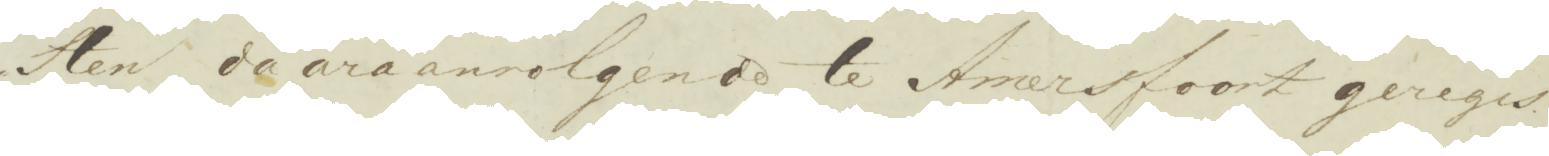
sten daaraanvolgende te Amersfoort geregis.
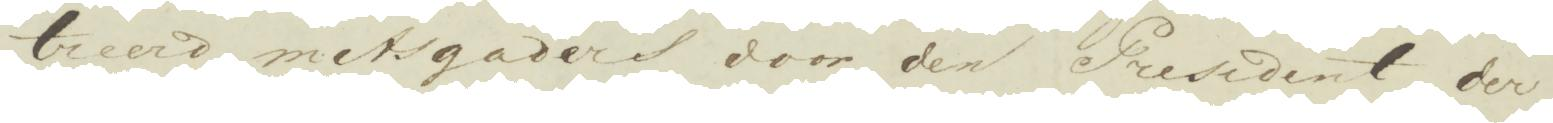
treerd mitsgaders door den President der
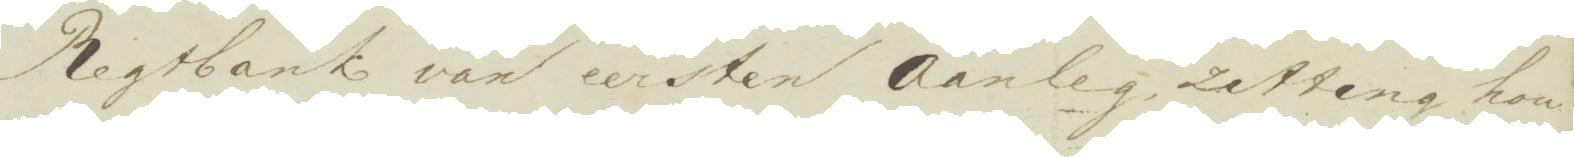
Regtbank van eersten Aanleg, zitting hou
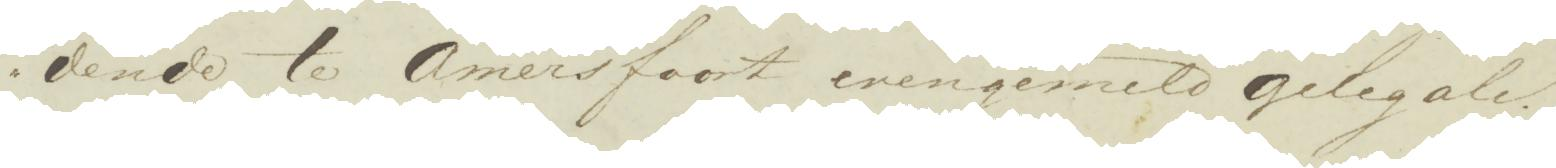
„ dende te Amersfoort evengemeld gelegali.
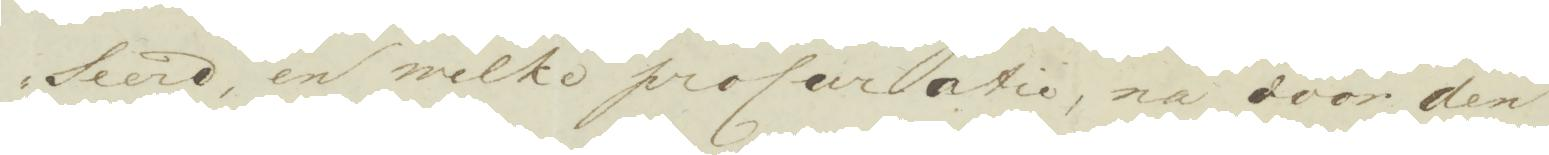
„seerd, en welke procuratie, na door den
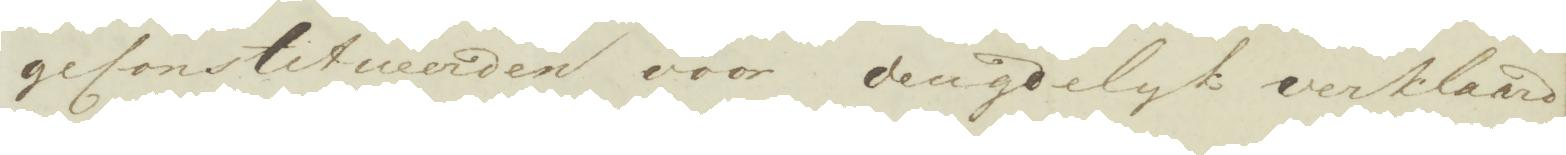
geconstitueerden voor deugdelyk verklaard
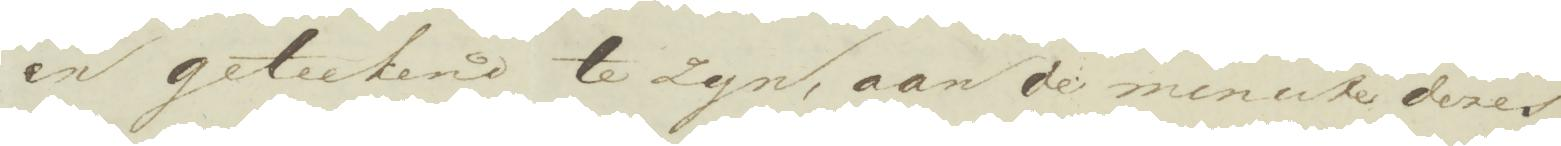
en geteekend te zyn, aan de minute dezes
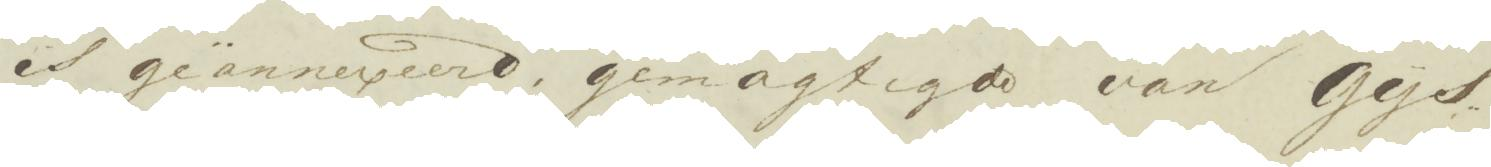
is geännexeerd, gemagtigde van Gijs„
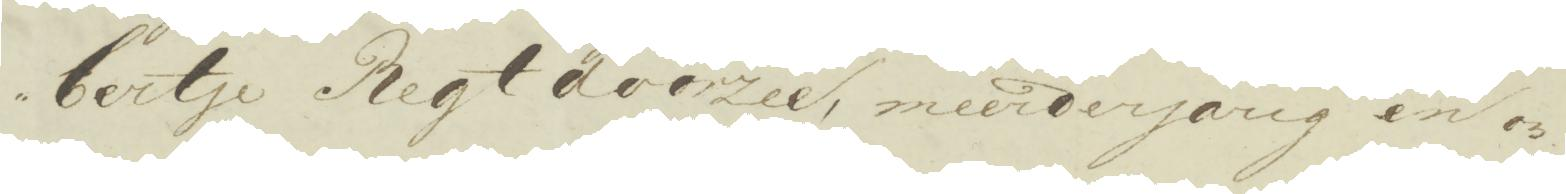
„ bertje Regtdoorzee, meerderjarig en on
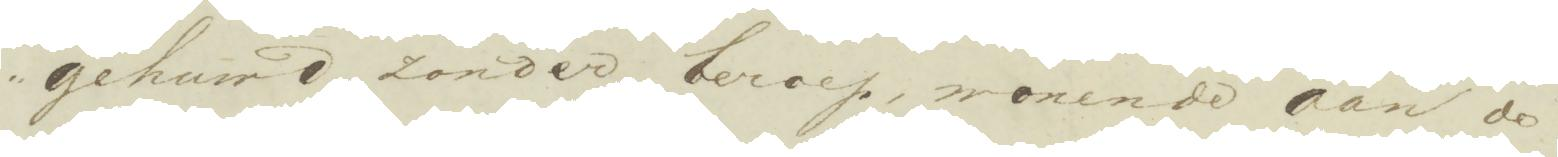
„ gehuwd, zonder beroep, wonende aan de
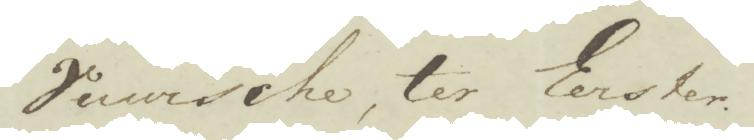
Vuursche, ter Eerster.
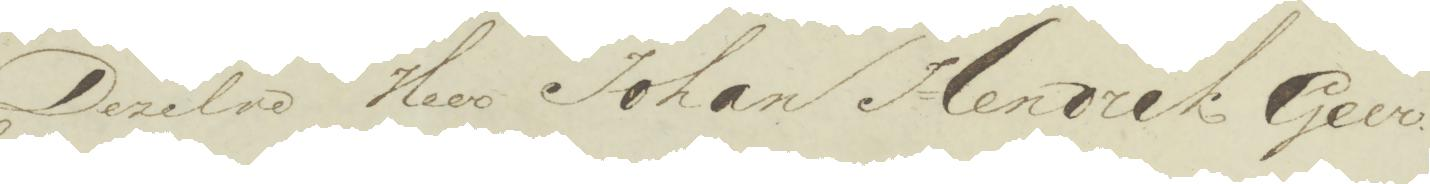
Dezelve Heer Johan Hendrik Geer.
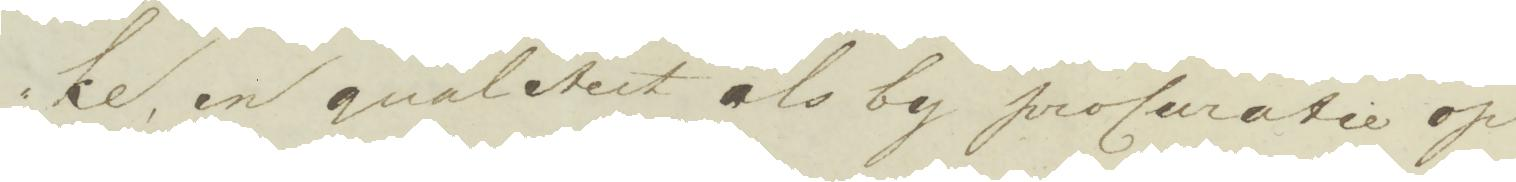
„ ke, in qualiteit als by procuratie op
